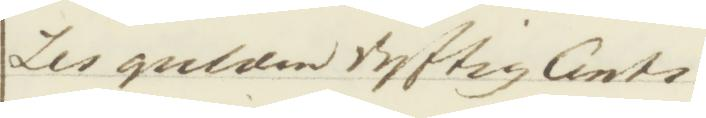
Zes gulden Vyftig Cents
